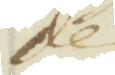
d:e
